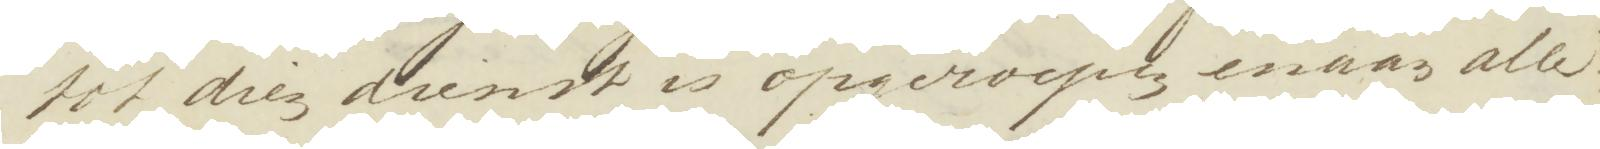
tot dien dienst is opgeroepen en aan alle
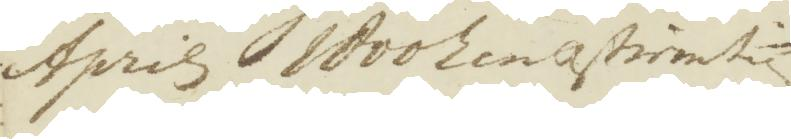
April 1800 Een entwintig
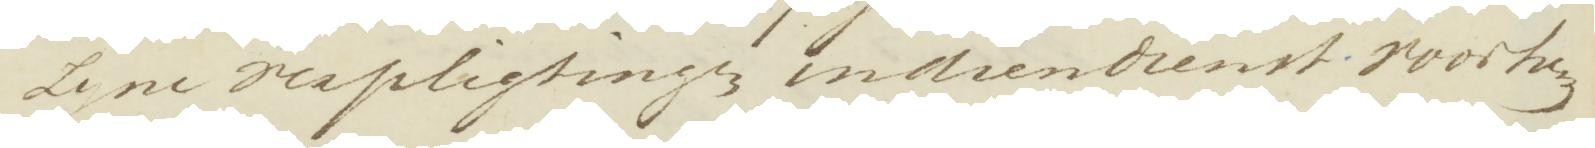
zyne verpligtingen in dien dienst voor hem
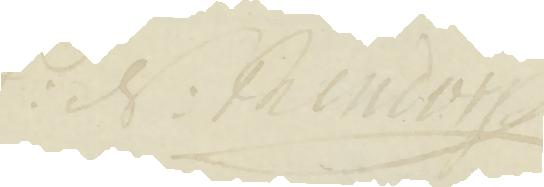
P: N: Rendorp
